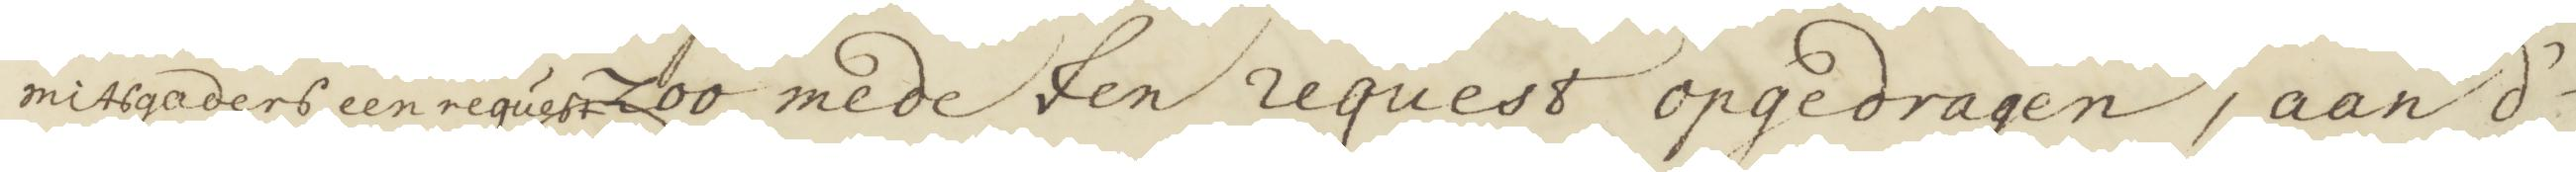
mitsgaders een request zoo mede een request opgedragen, aan d'=
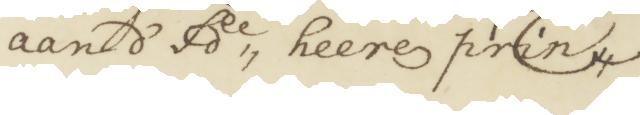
aan d’ Ed„le heere Prin„
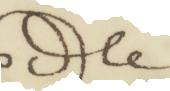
ele
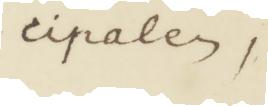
cipalen,
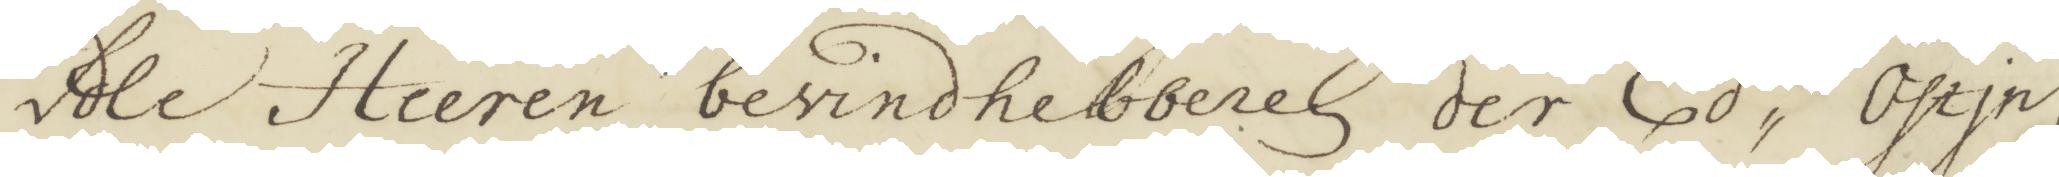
Edle Heeren bevindhebberen der Ed„ Ostjn„
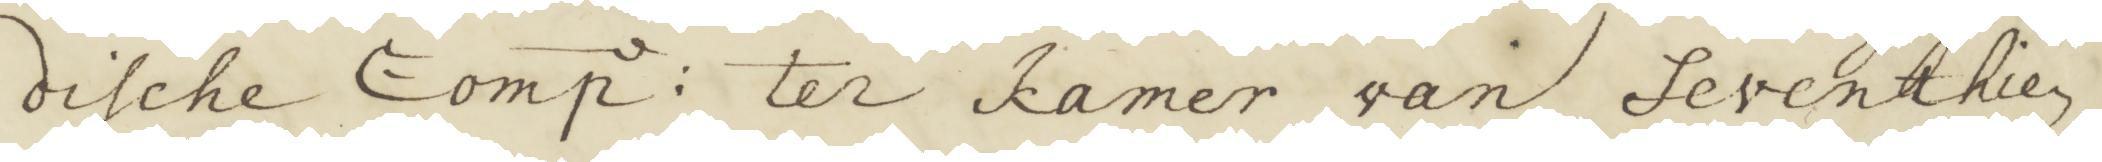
dische Comp:e ter kamer van seventhien
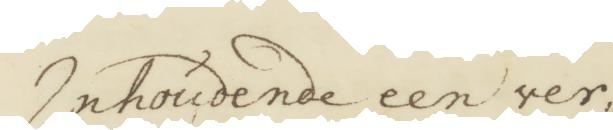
Jnhoudende een ver„
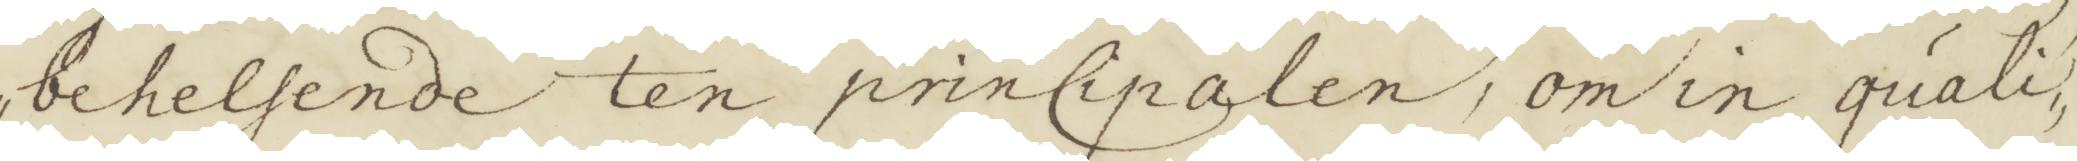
behelsende ter principalen, om in quali„
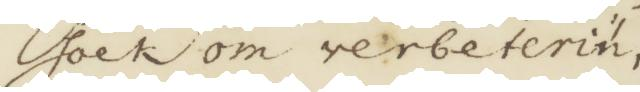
soek om verbeterin„
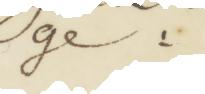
ge : —
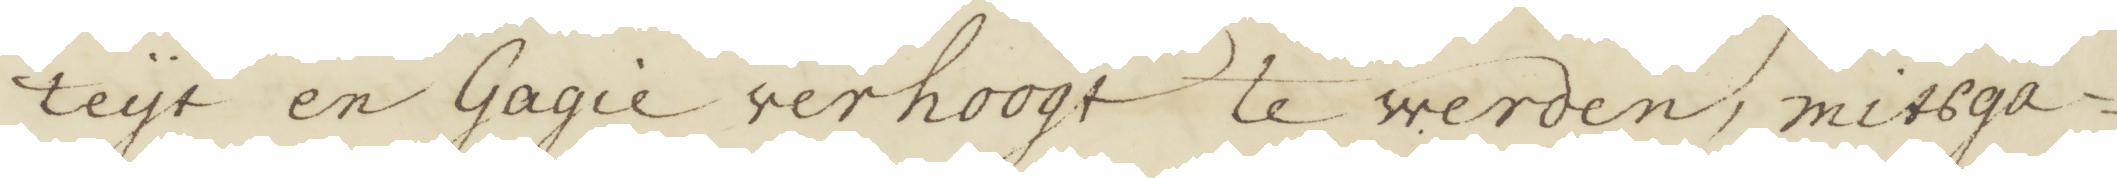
teijt en Gagie verhoogt te werden; mitsga=
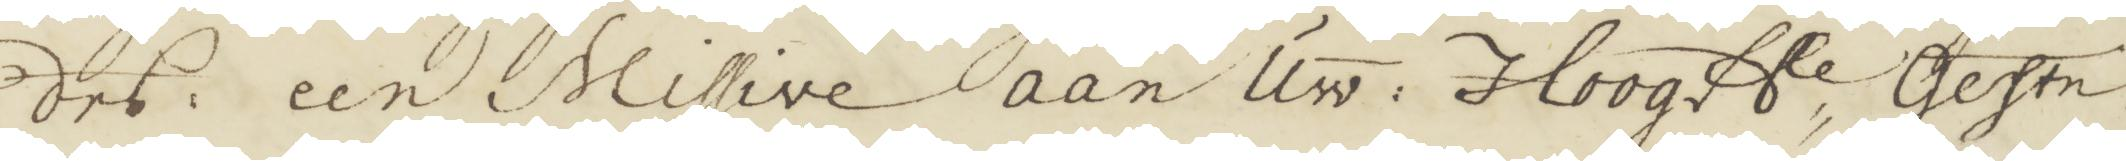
drs: een Missive aan Uw: HoogEd„le gestr:
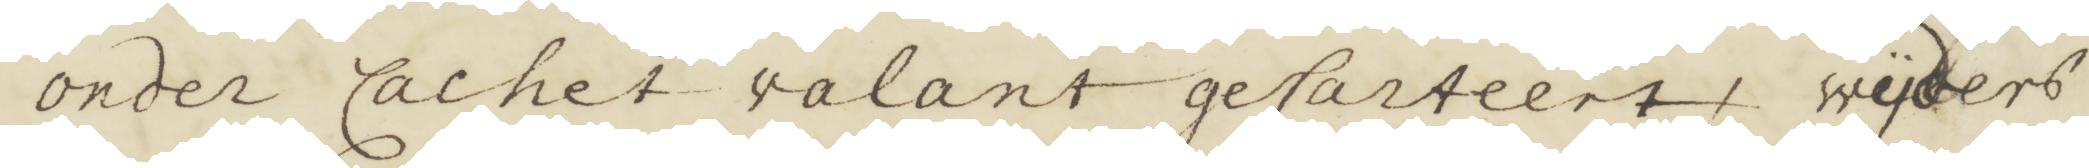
onder Cachet valant gecarteert, wijders
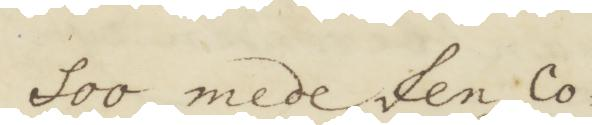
soo mede een Co=
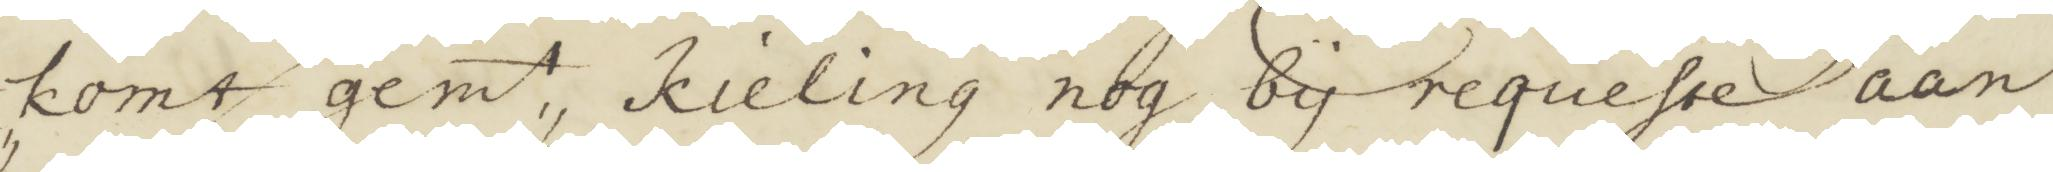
komt gem„t kieling nog bij requeste aan
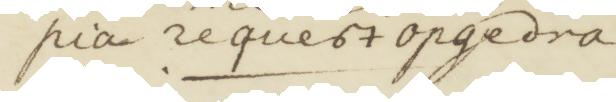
pia request opgedra
